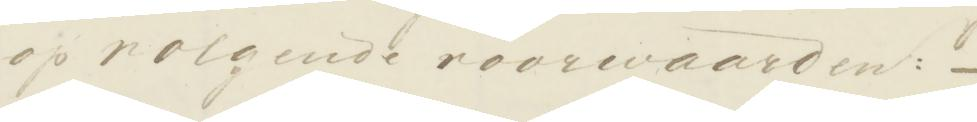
op volgende voorwaarden:
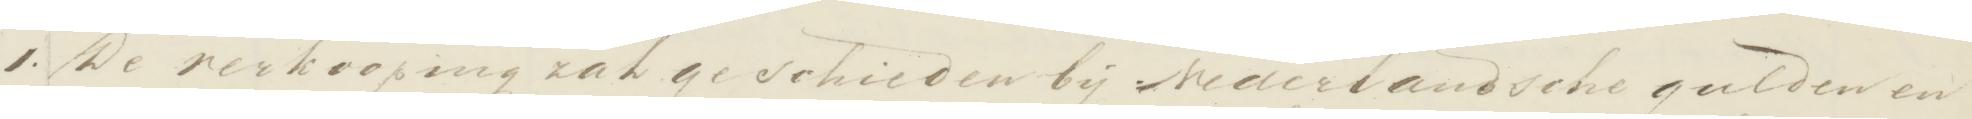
1. De verkooping zal geschieden bij Nederlandsche gulden en
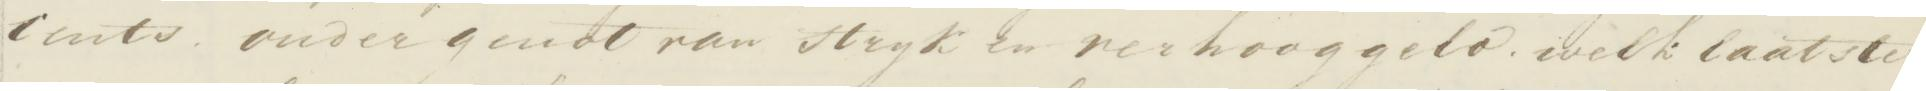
cents, onder genot van strijk en verhooggeld, welk laatste
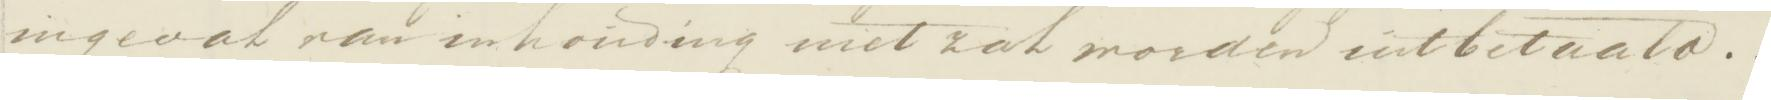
ingeval van inhouding niet zal worden uitbetaald.
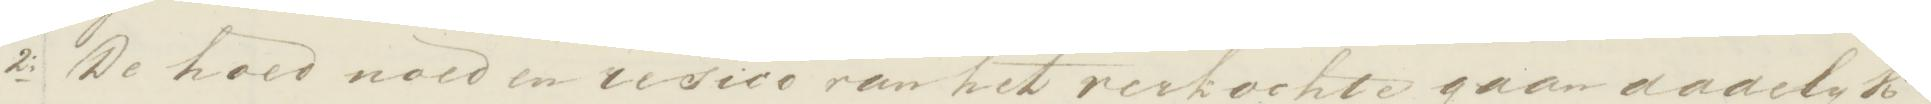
2: De hoed noed en risico van het verkochte gaan dadelijk
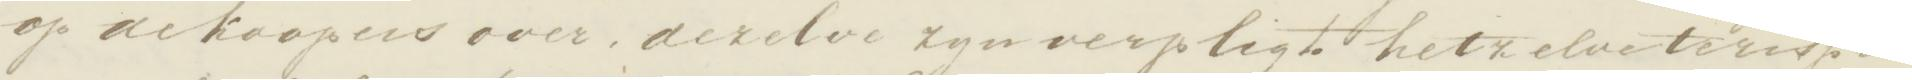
op de koopers over, dezelve zijn verpligt hetzelve te rispen
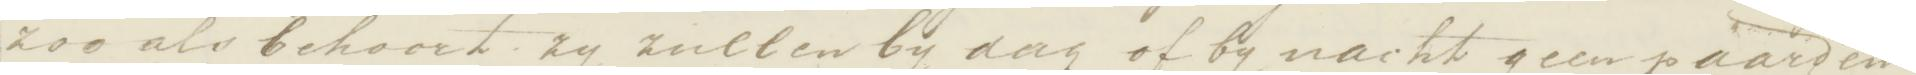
zoo als behoort. zy zullen by dag of by nacht geen paarden
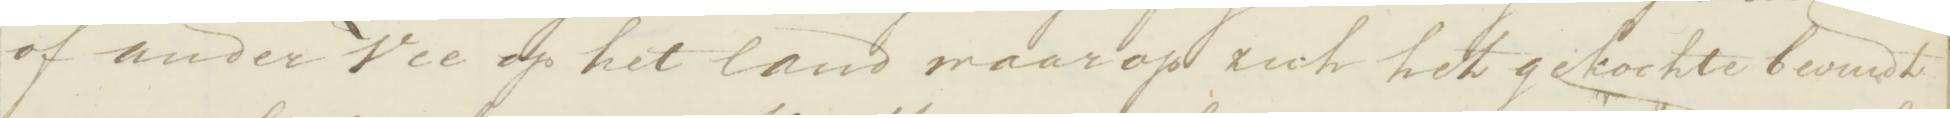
of ander Vee op het land waarop zich het gekochte bevindt
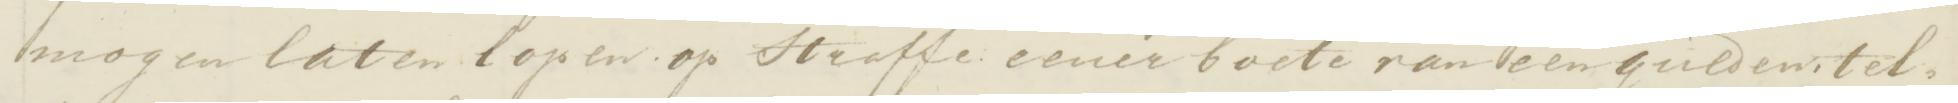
mogen laten lopen. op straffe eener boete van een gulden, tel„
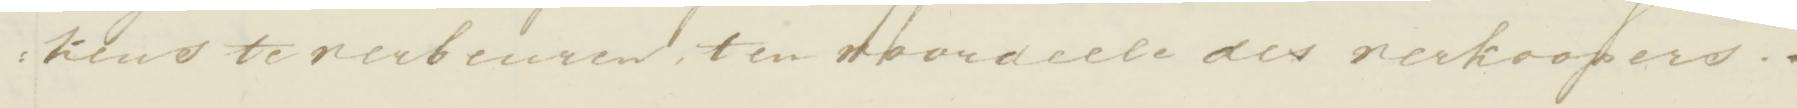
„kens te verbeuren, ten voordeele des verkoopers.
